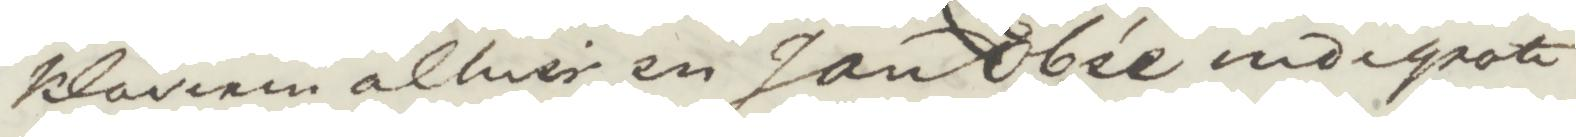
klaveren alhier en Jan Obée in de grote
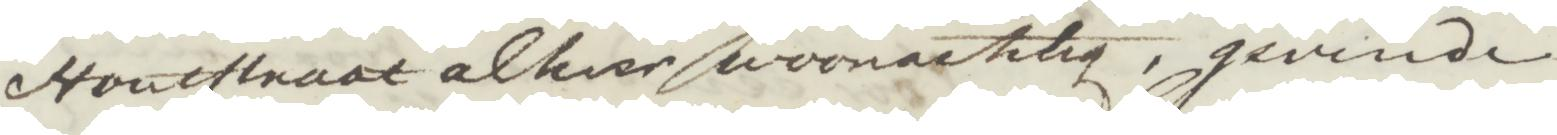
Houtstraat alhier woonachtig, gevende
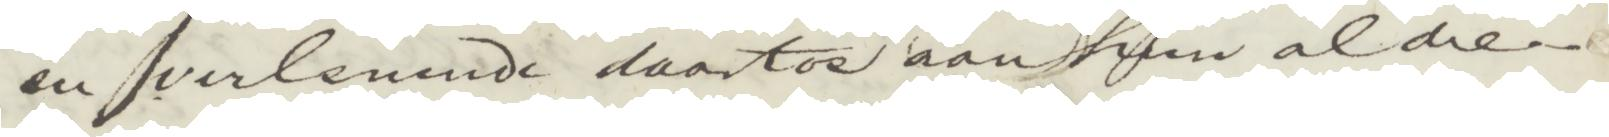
en verlenende daartoe aaan hun al die
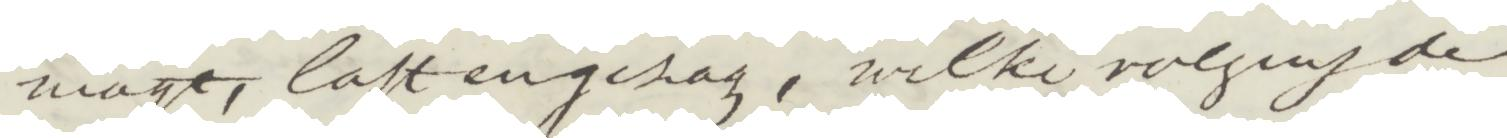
magt, last en gezag, welke volgens de
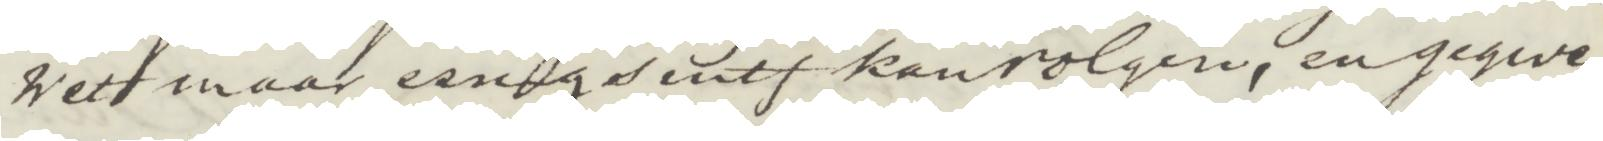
wet maar eenigsints kan volgen, en gegeven
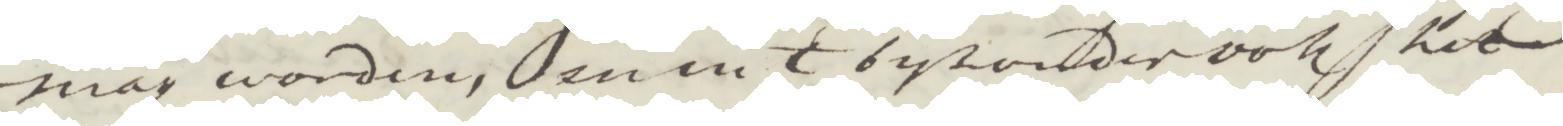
mag worden, en in 't byzonder ook het
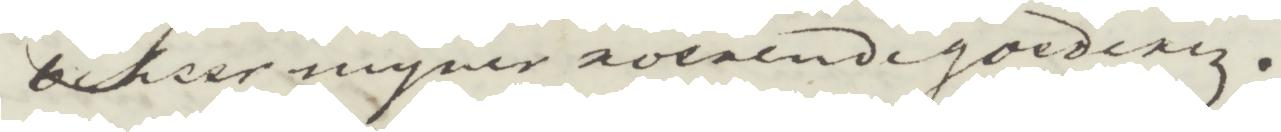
beheer myner roerende goederen.
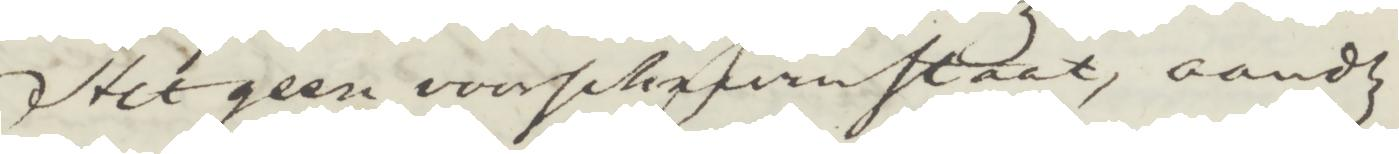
Het geen voorschreven staat, aanden
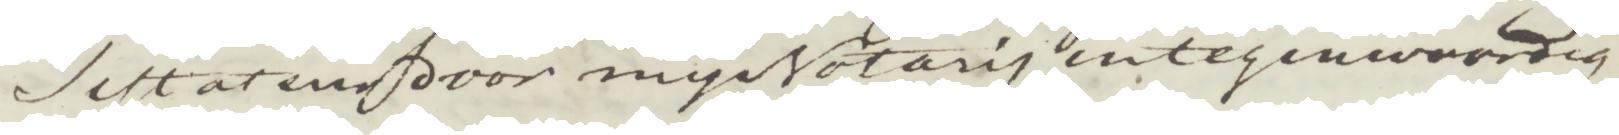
Testateur voor my Notaris integenwoordig
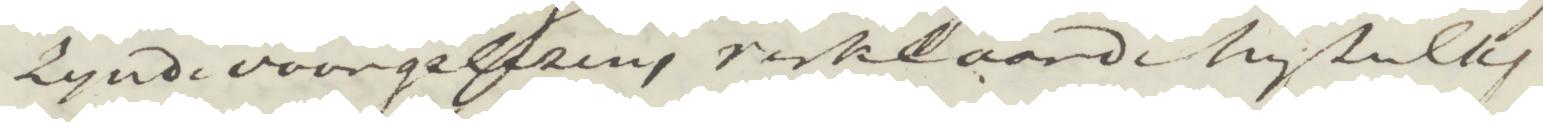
zynde voorgelezen, verklaarde zy zulks
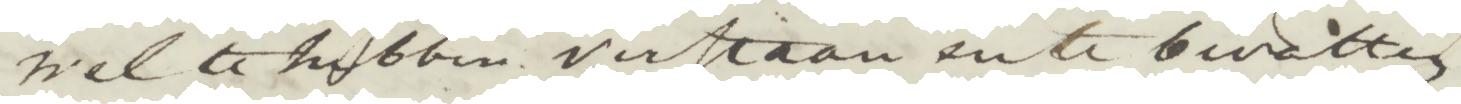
wel te hebben verstaan en te bevatten
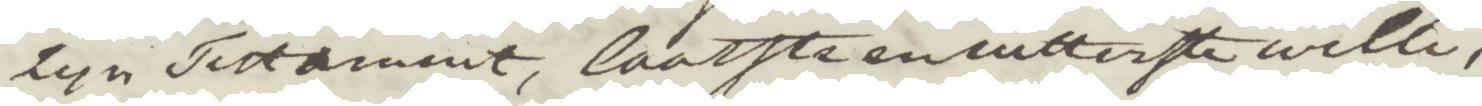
zyn Testament, laatste en uitterste wille,
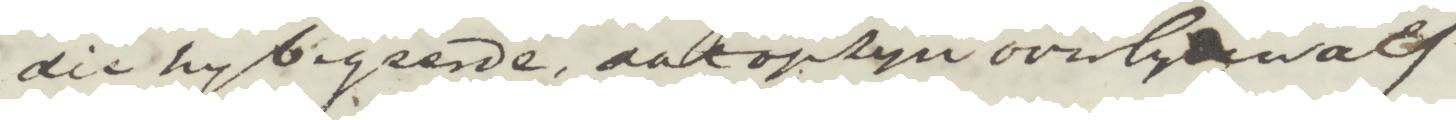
die hy begeerde, dat op zyn overlyden als
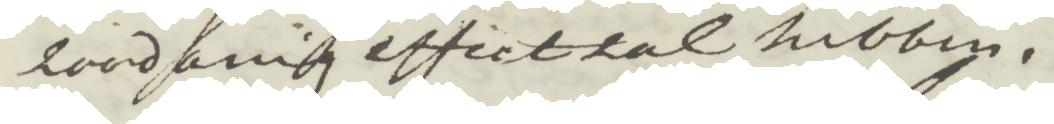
zoodanig effect zal hebben.
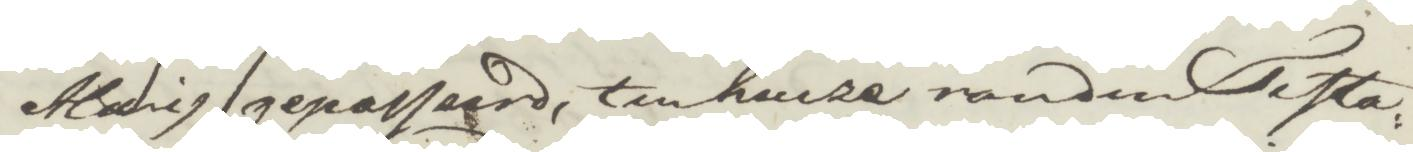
Alddug gepasseerd, ten huize van den Testa„
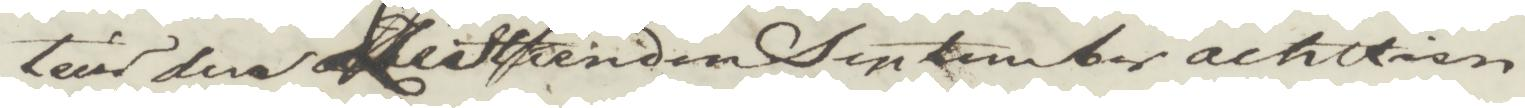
teur den Zestienden September achttien
